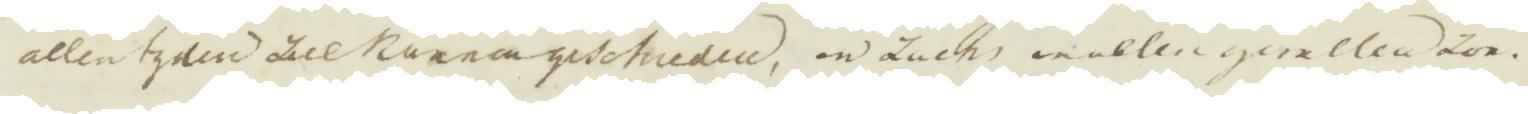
allen tyden zal kunnen geschieden, en zulks in allen gevallen zon„
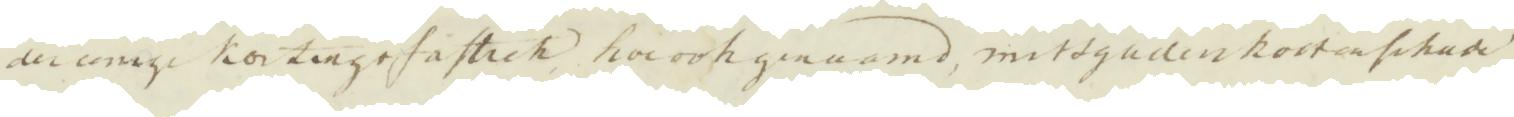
der eenige korting of aftreck hoe ook genaamd, mitsgaders kostenschade
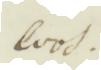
loos
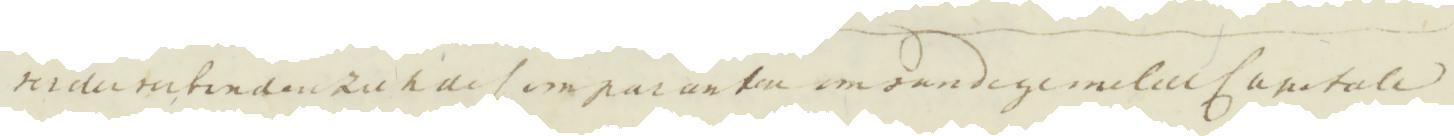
verder verbinden zich de Comparanten om van de gemelde Capitale
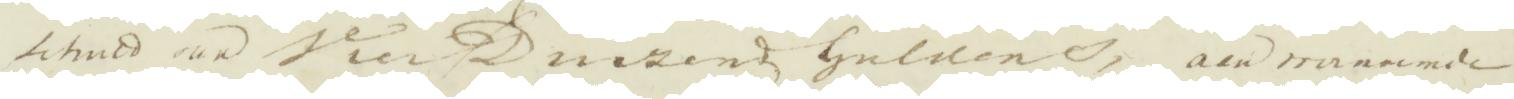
Schuld van Vier Duizend Guldens, aen voornoemde
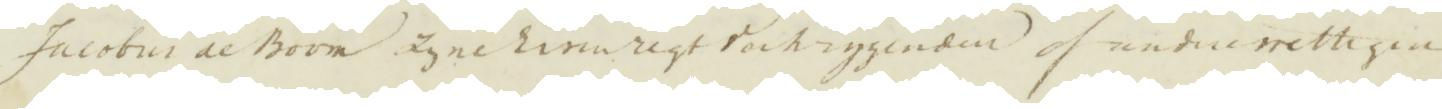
Jacobus de Boom zyne Eer en regt verkrygenden of onder wettigen
